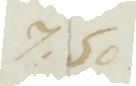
7.50
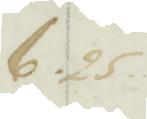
6.25.
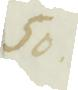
7.50.
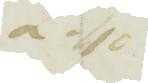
2.40
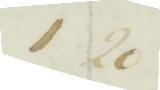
1 .20
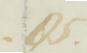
.85.
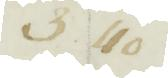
3. 40
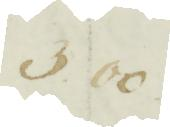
3.00
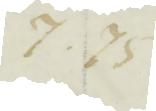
7.75
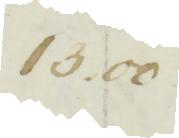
13.00
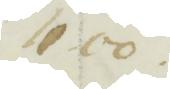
4.00.
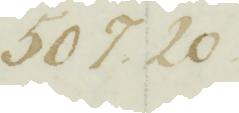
507.20
